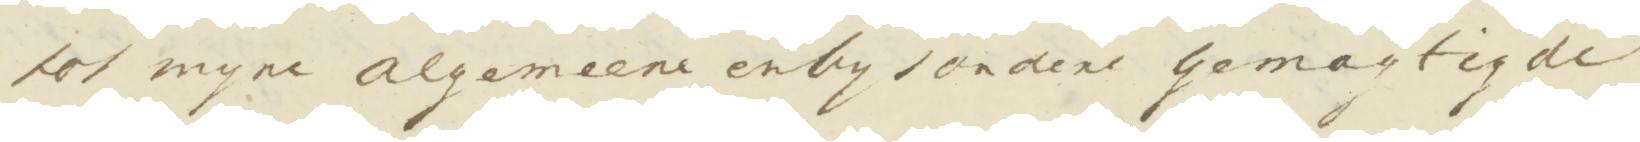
tot myne algemeene en bysondere gemagtigde
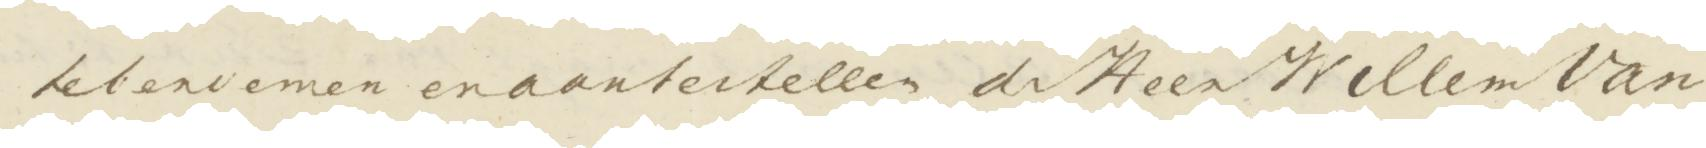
te benoemen en aantestellen de Heer Willem Van
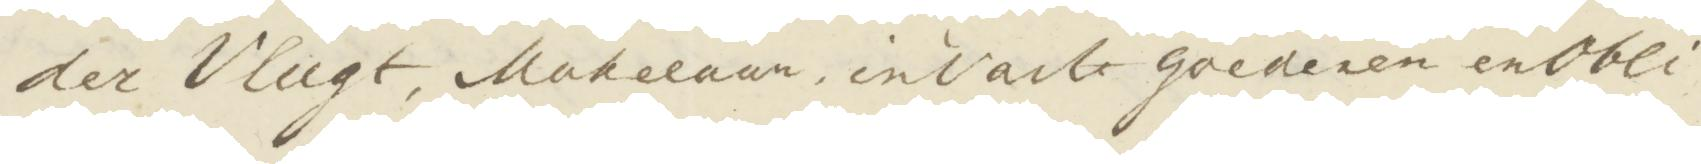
der Vlugt, Makelaar, in vaste goederen en Obli
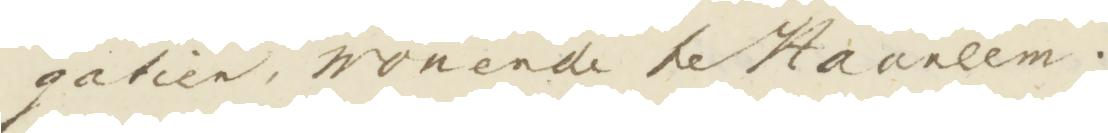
gatien, wonende te Haarlem.
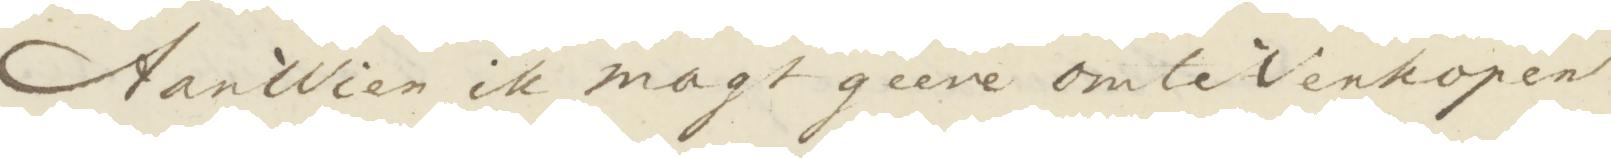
Aan wien ik magt geeve om te verkopen
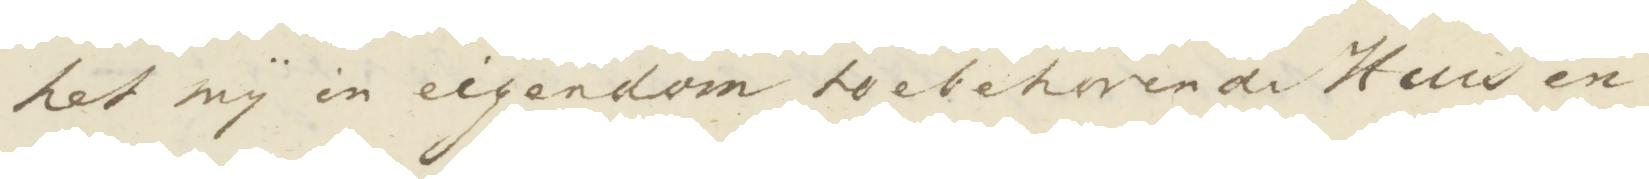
het mij in eigendom toebehorende Huis en
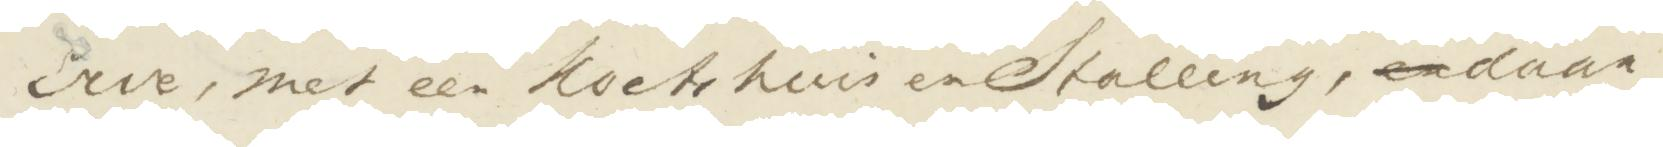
Erve, met een koetshuis en Stalling, en daar
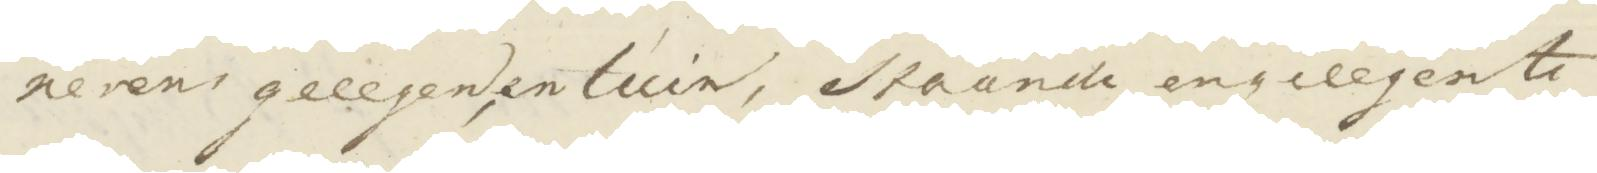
nevens gelegen, en tuin, staande en gelegen te
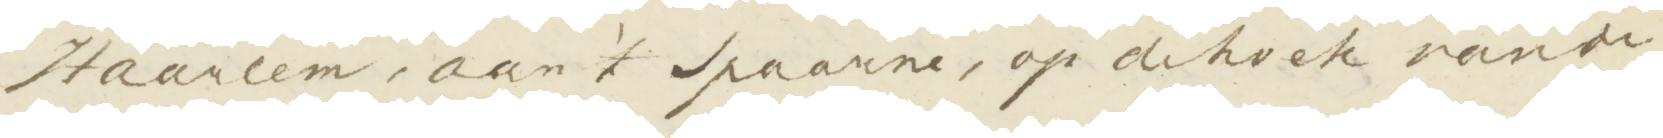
Haarlem, aan ’t spaarne, op de hoek van de
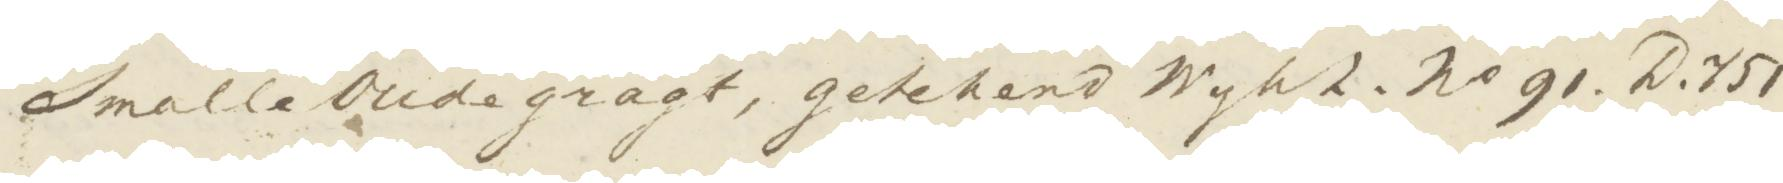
Smalle Oude gragt, getekend Wyk 2. No 91. D. 751
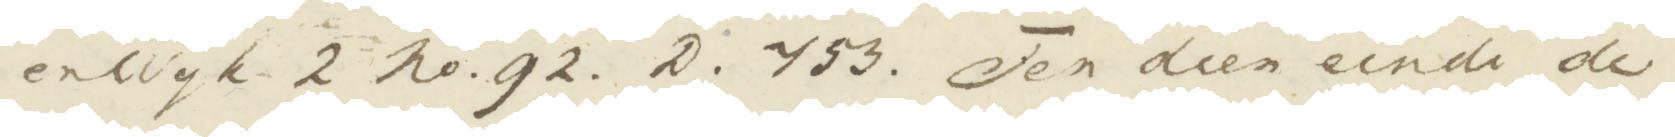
en Wyk 2 No. 92. D. 753. Ten dien einde de
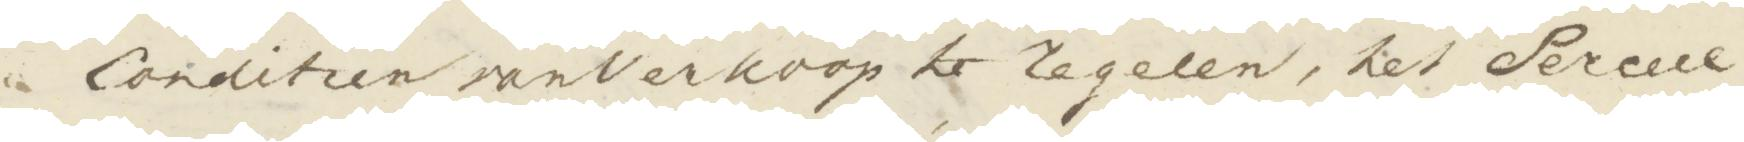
conditien van verkoop te regelen, het Perceel
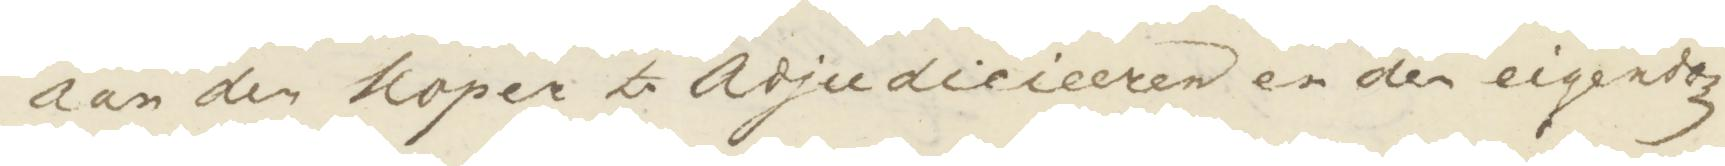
aan den koper te Adjudicieeren en den eigendom
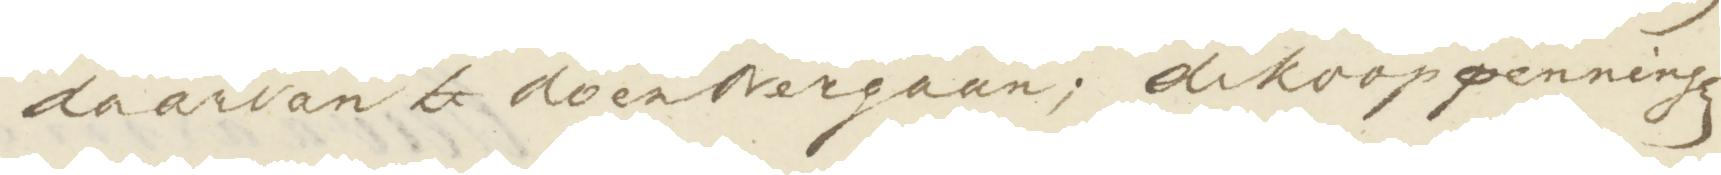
daarvan te doen overgaan; de kooppenningen
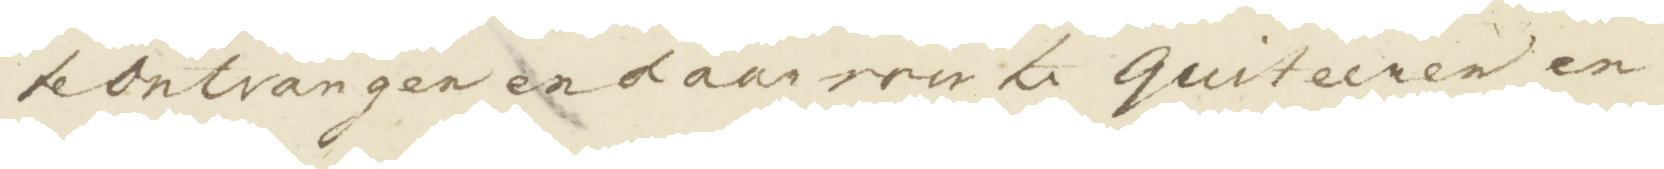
te ontvangen en daar voor te quiteeren en
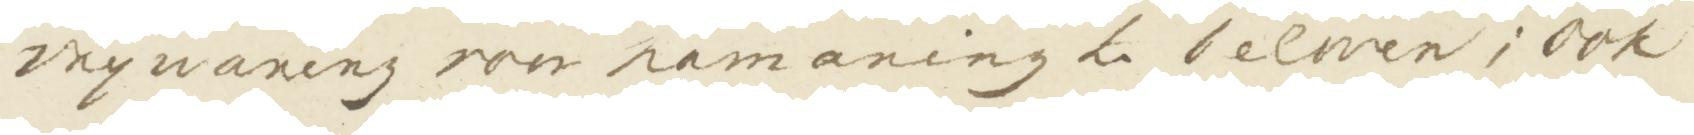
vrijwaring voor namaning te beloven; ook
